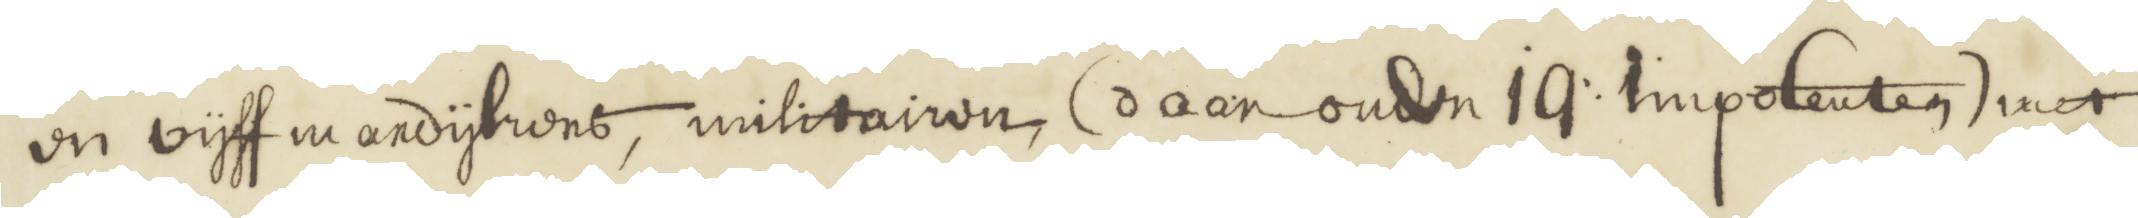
en vijff mardijkers, militairen, (daar onder 14: impotenten) met
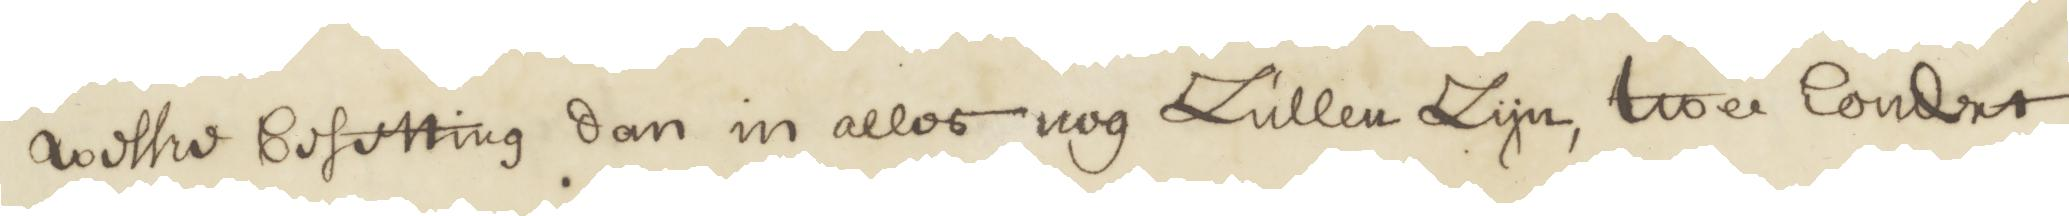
welke besetting dan in alles nog Zullen zijn, twee hondert
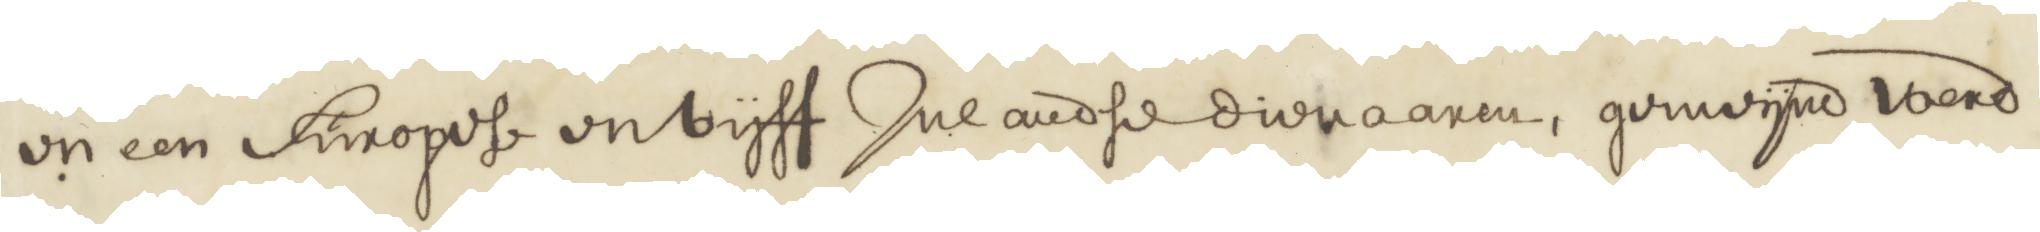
en een Europese en vijff Jnlandse dienaaren, gemeijnd werd
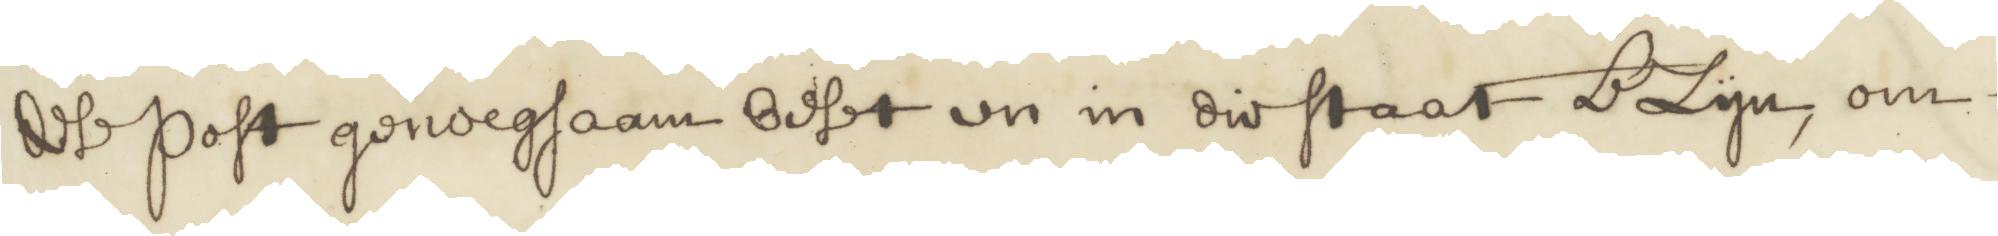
dese post genoegsaam beset en in die staat te Zijn, om
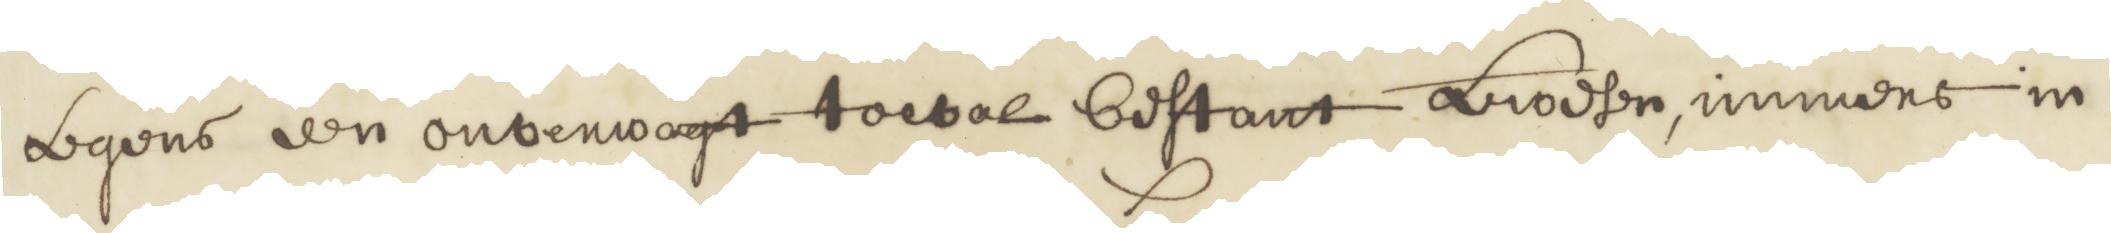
tegens een onverwagt toeval bestant tewesen, immers in
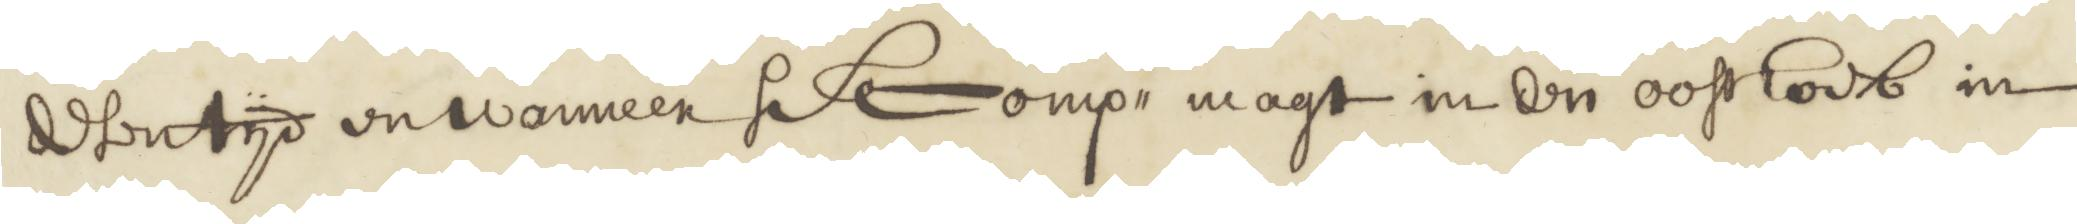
desen tijd en wanneer s'E Comp„s magt in den oost hoek in
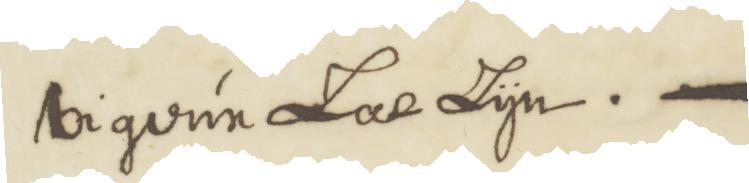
vigeur Zal Zijn. —
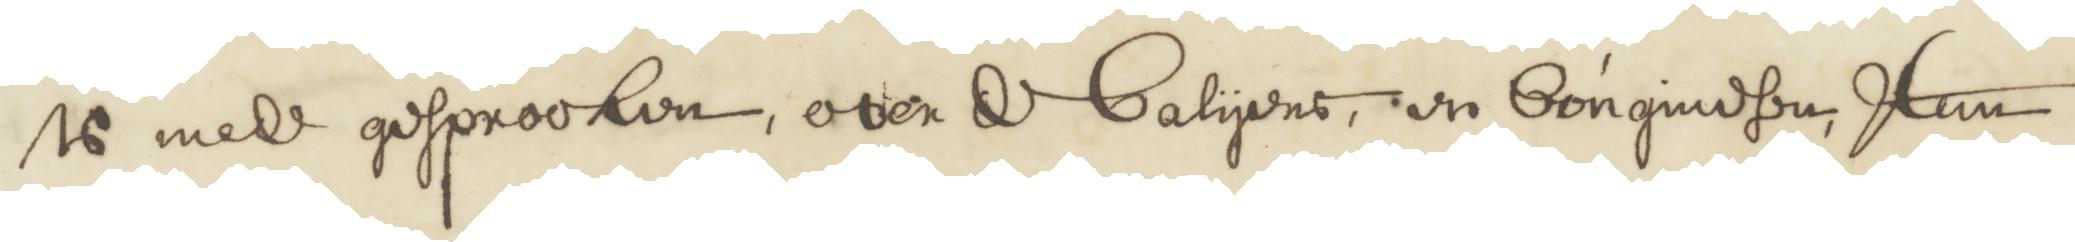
is mede gesprooken, over de balijers, en bouginesen, Jtem
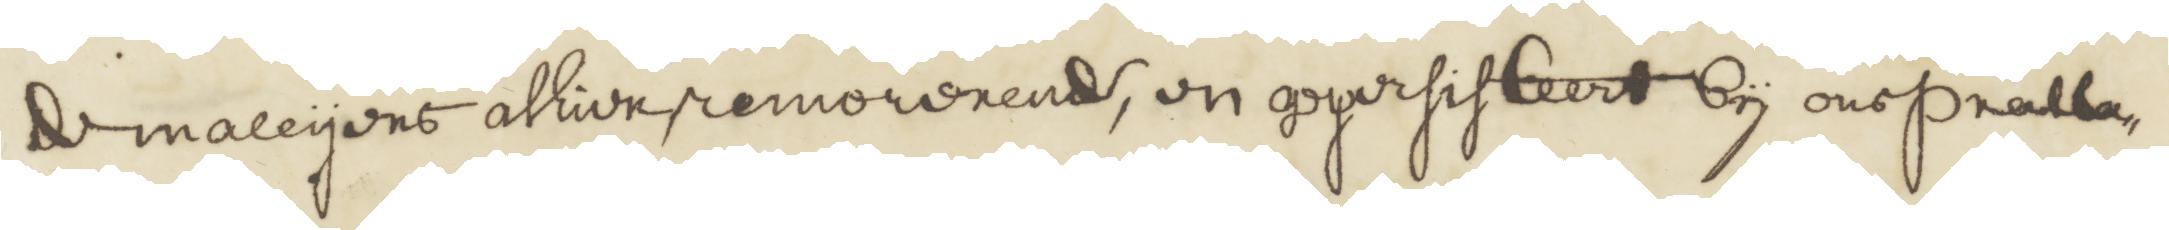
de maleijers alhier, remorerende, en gepersisteert bij ons praela„
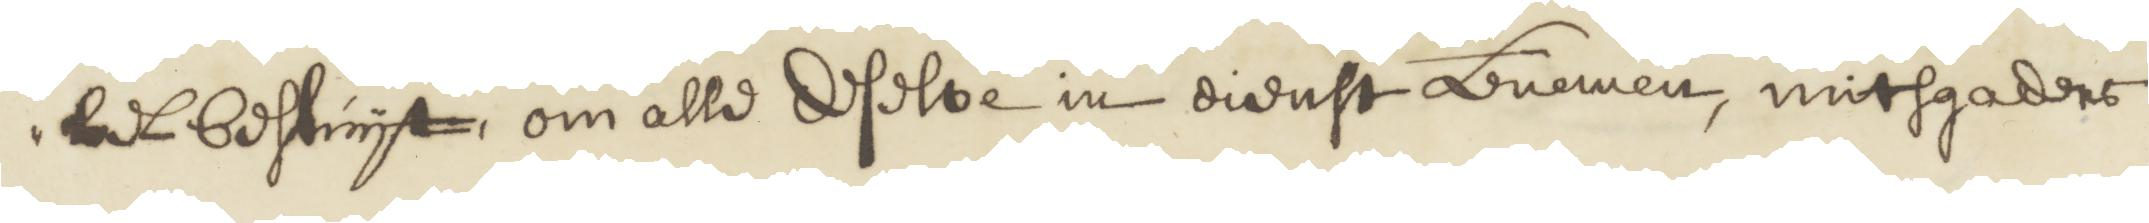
„bel besluijt, om alle deselve in dienst tenemen, mitsgaders
